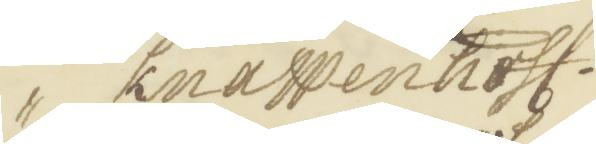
„ knappenhoff
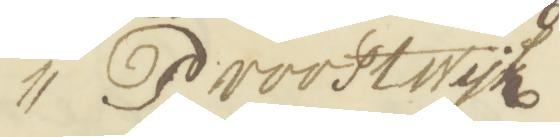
„ Proostwijk
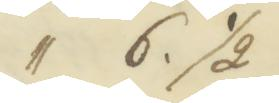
„ 6. ½
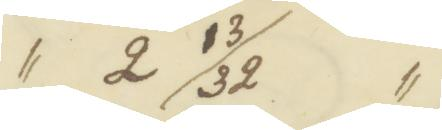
„ 2 13/32 „
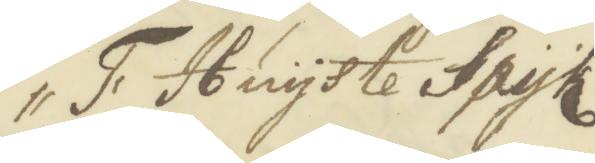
„ T Huijs te Spijk
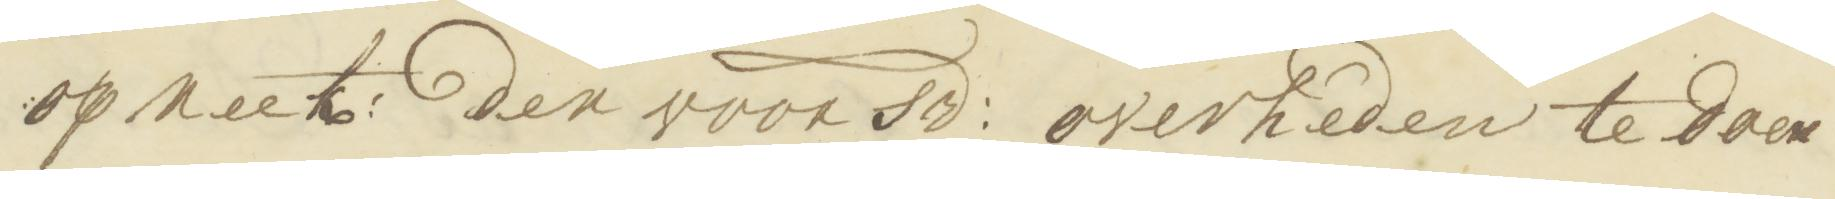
op reek: der voorsz: overheden te daer
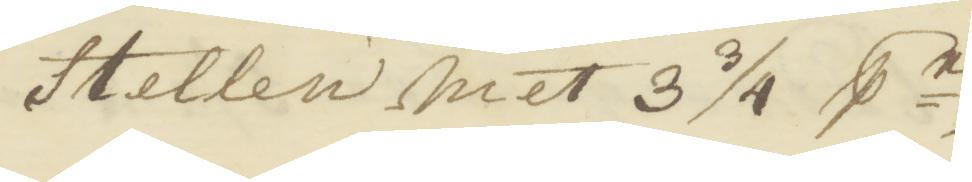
stellen met 3¾ p=rC=to advans, off zoo
